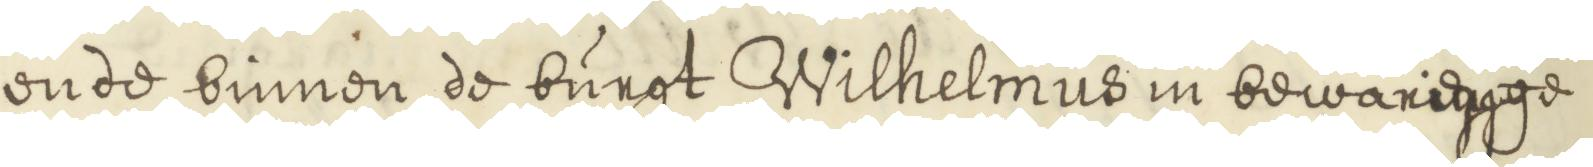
en de binnen de burgt Wilhelmus in bewaring ge
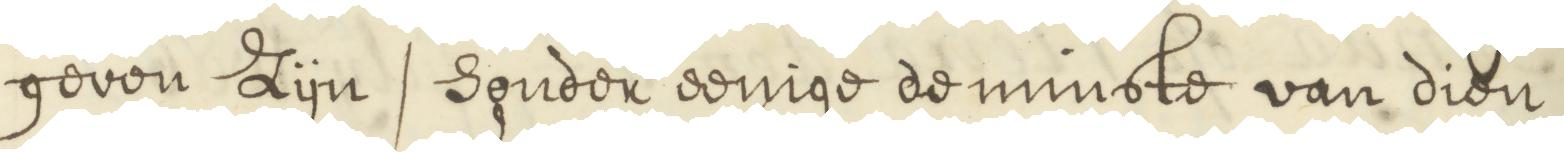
geven zijn / sonder eenige de minste van dien
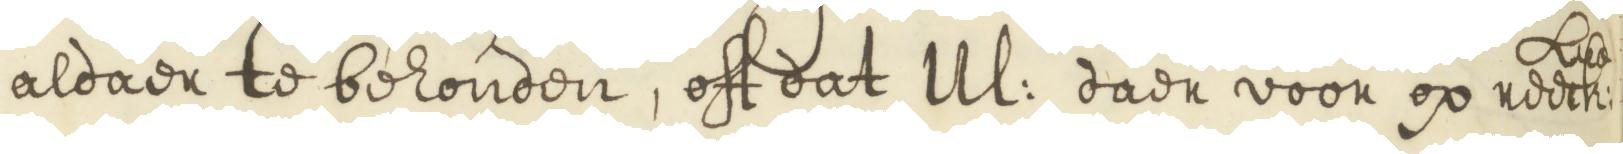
aldaer te behouden, off dat Ul: daer voor op reeck:
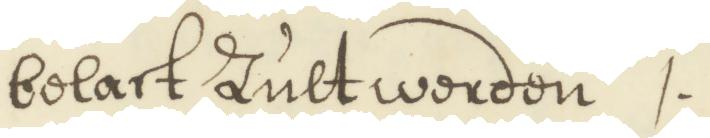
belast zult werden /.
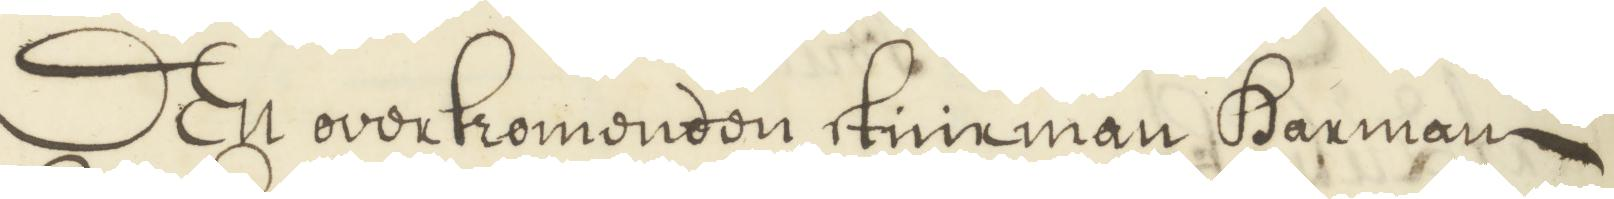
Een overkomenden stuirman Harman
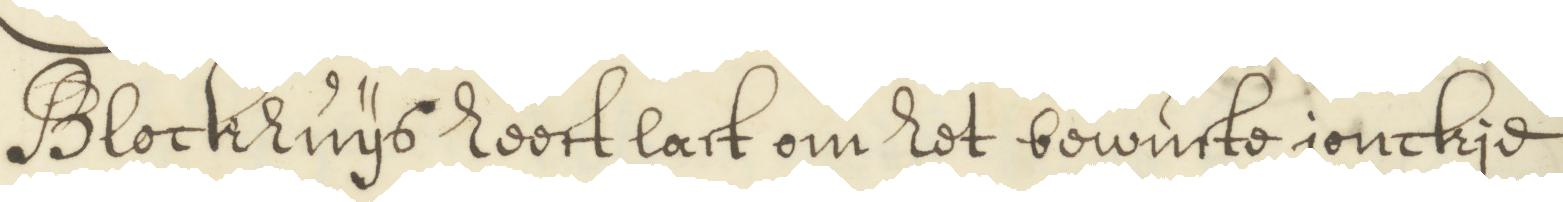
Blockhuijs heeft last om het bewuste jonckje
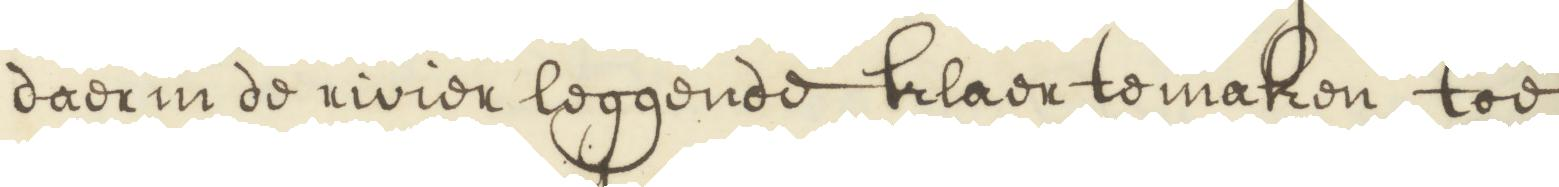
daer in de rivier leggende klaer te maken toe
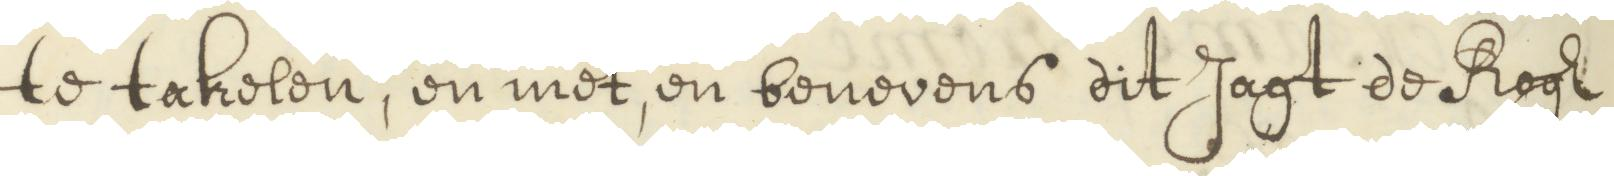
te takelen, en met, en benevens dit Jagt de Rogh
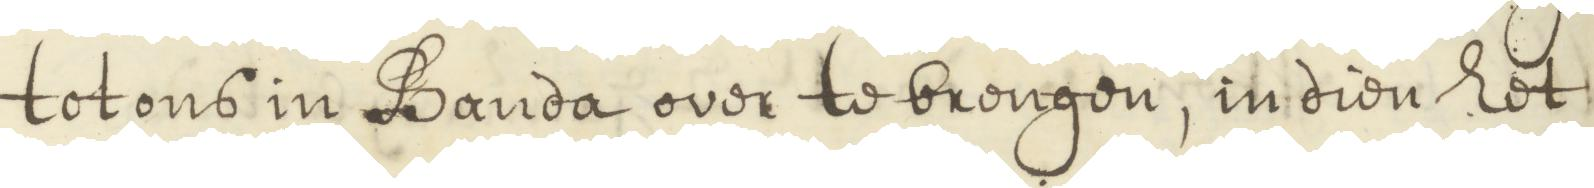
tot ons in Banda over te brengen, in dien het
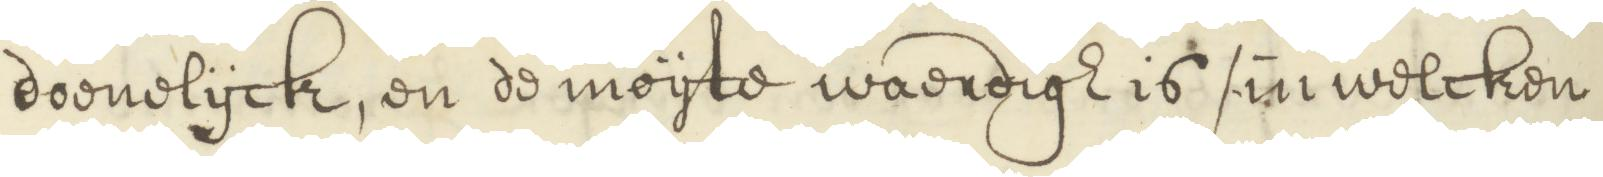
doenelijck, en de moijte waerdigh is / in welcken
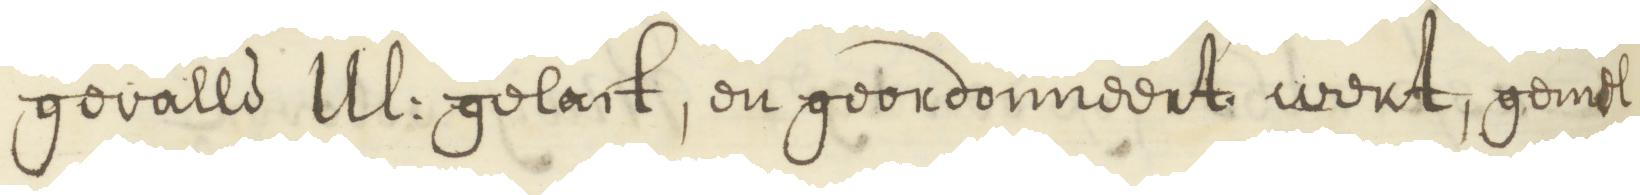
gevalle Ul: gelast, en geordonneert wert, gemel
